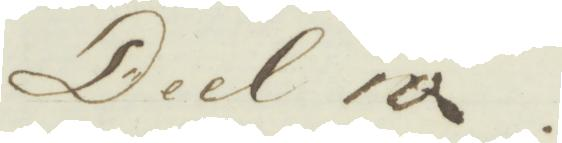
Deel 10.
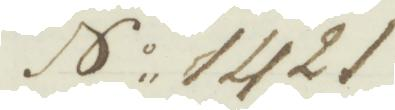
N„o 1421
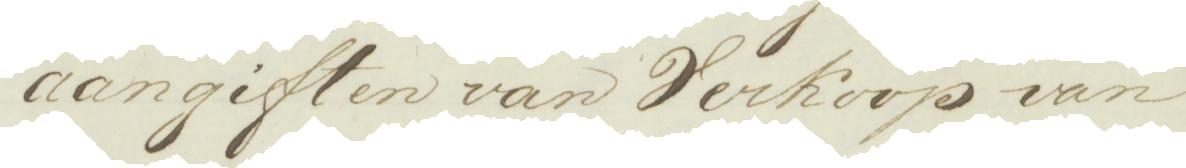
aangiften van Verkoop van
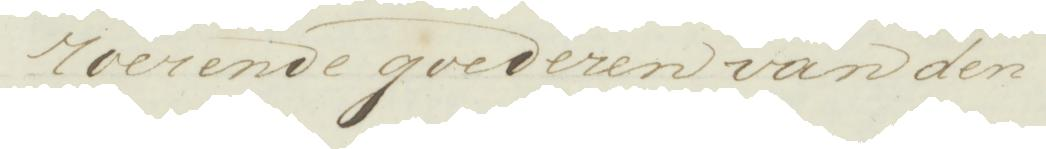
roerende goederen van den
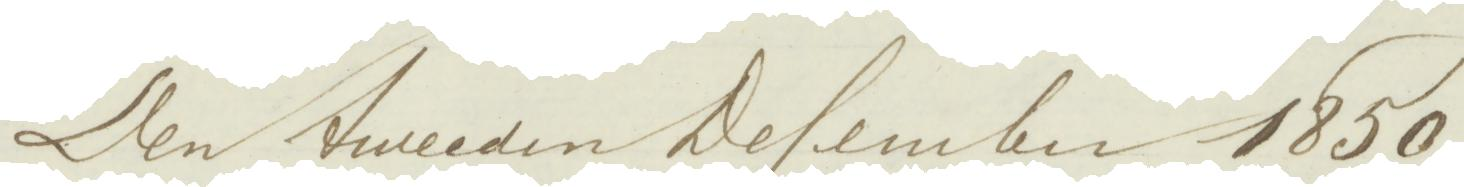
Den tweeden December 1850
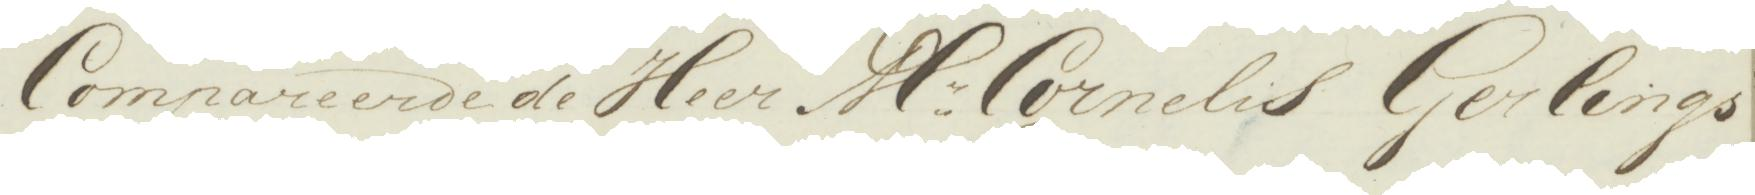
Compareerde de Heer M„r Cornelis Gerlings
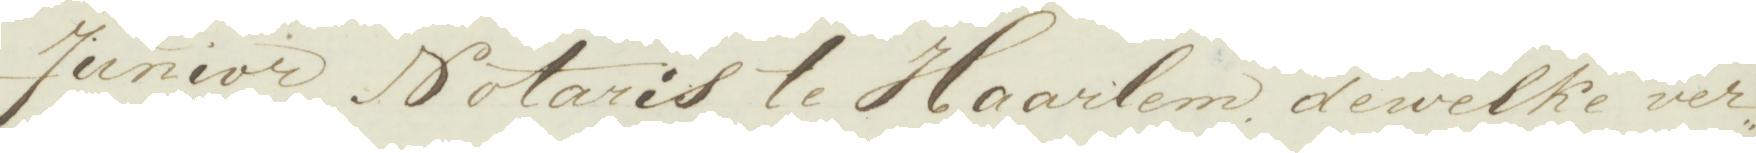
Junior Notaris te Haarlem, dewelke ver
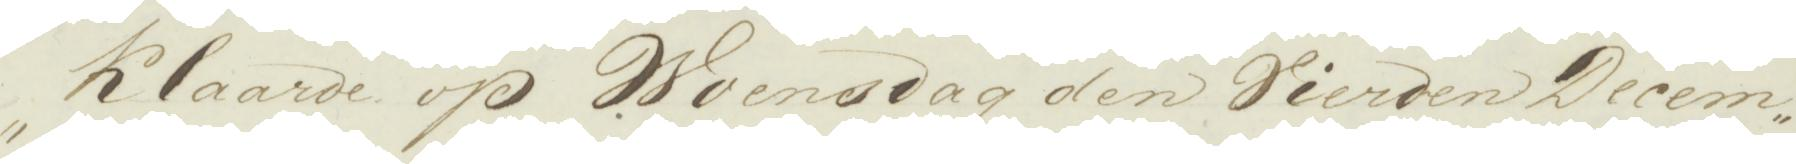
„klaarde op Woensdag den Vierden Decem„
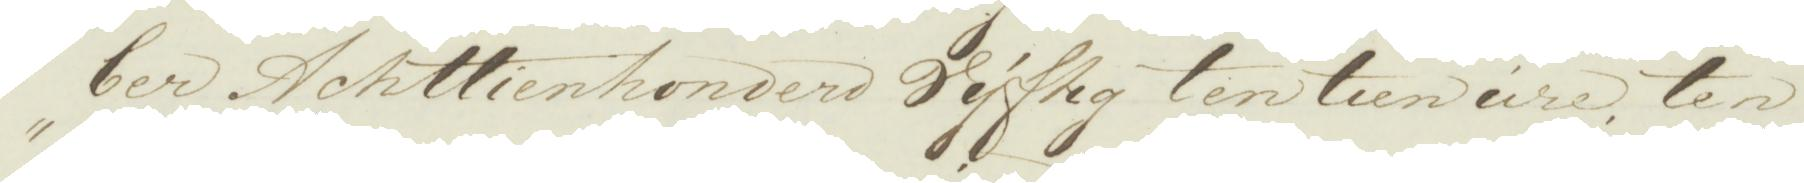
„ber Achttienhonderd Vijftig ten tien ure, ten
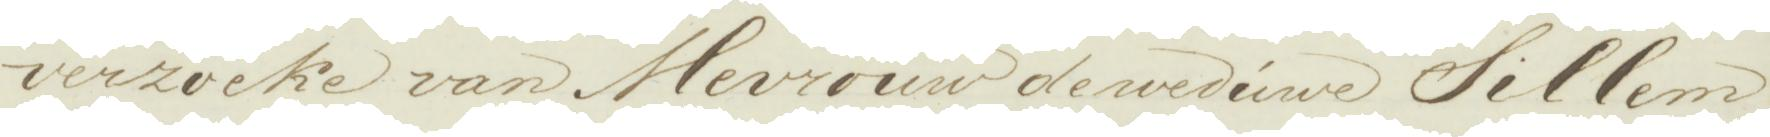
verzoeke van Mevrouw de weduwe Sillem
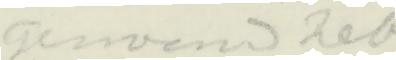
gewoond hebbend
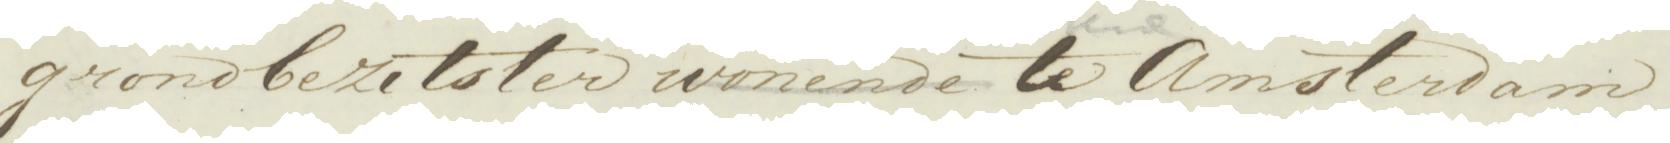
grondbezitster wonende te Amsterdam
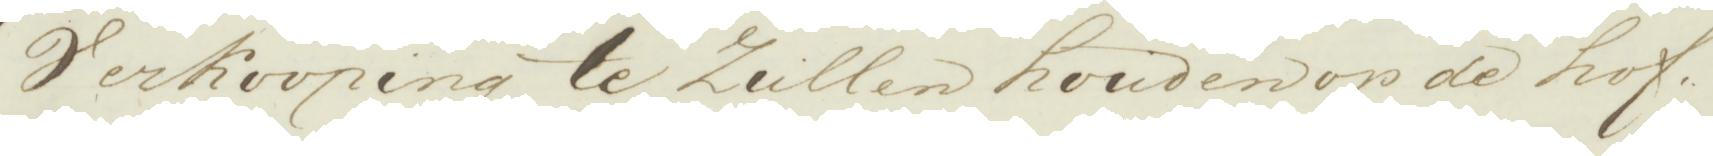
Verkooping te zullen houden op de hof„
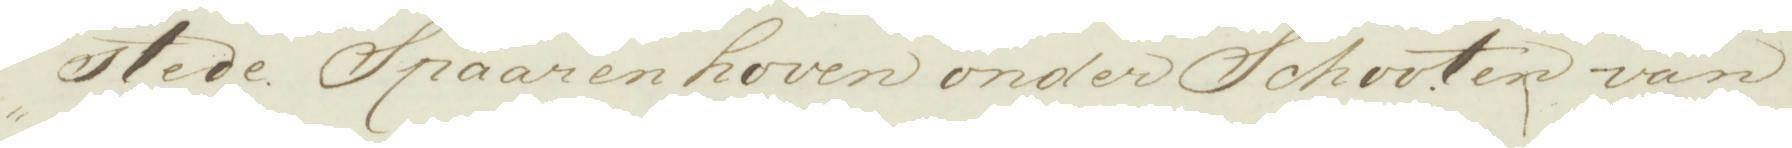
„stede Spaarenhoven onder Schooten van
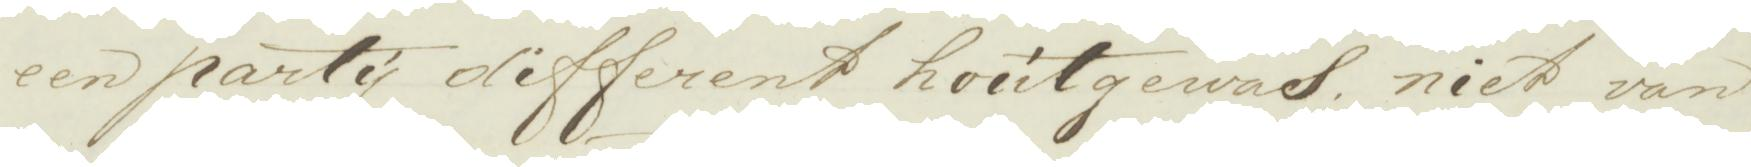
een partij different houtgewas, niet van
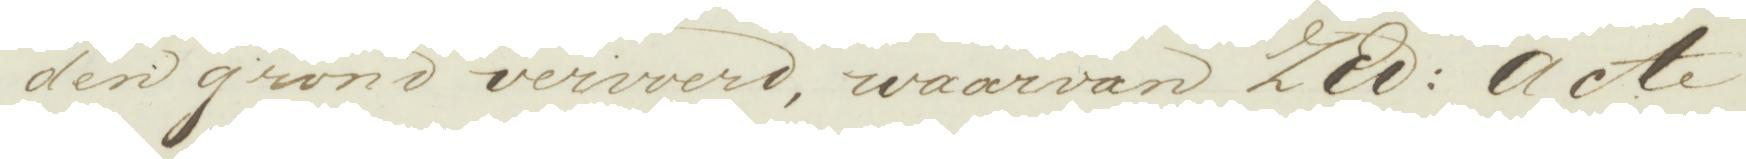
den grond vervoerd, waarvan ZEd: Acte
